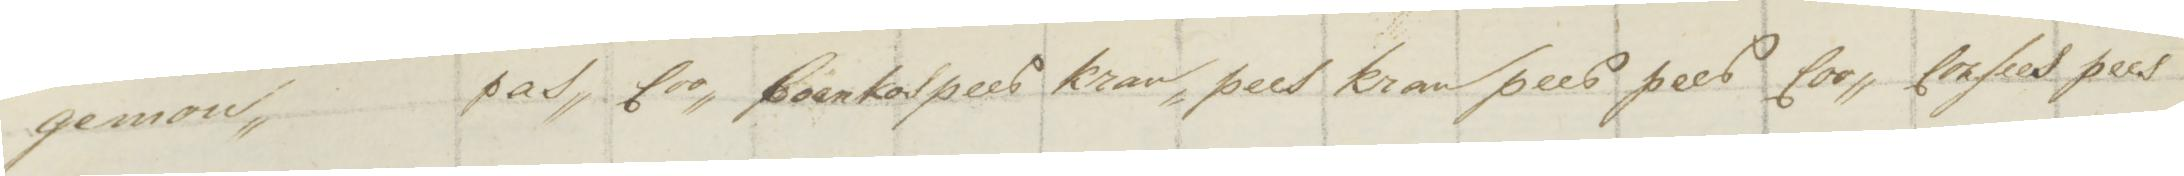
gemon„ pas„ Coo„ boenkospees kran„ pees kran pees pees Coo„ Corsees pees
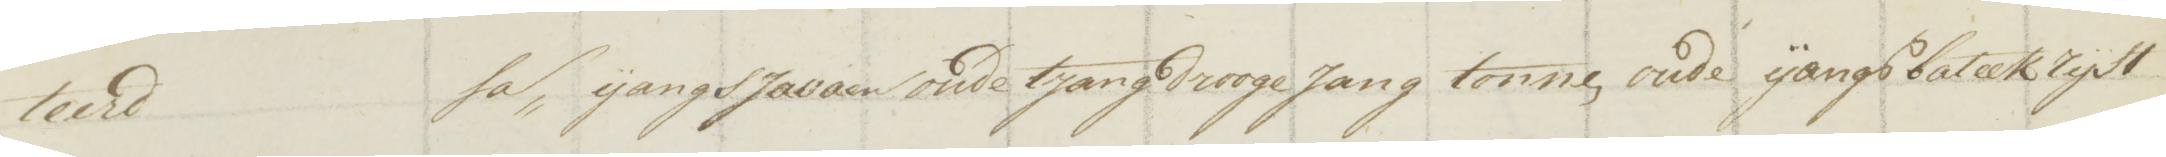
teerd sa„ ijangs Javaen oude tjang drooge Jang tonnen oude ijangs bateek rijst
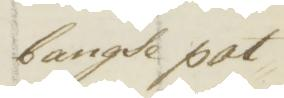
bangse pat
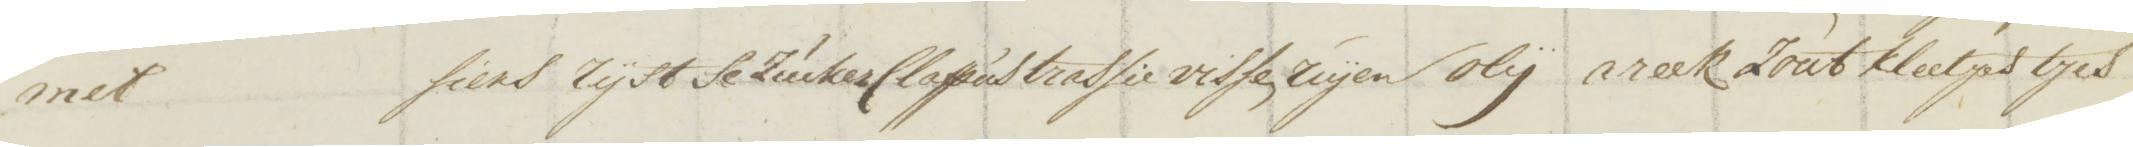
met siers rijst se zuiker Clappus trassie vissen Uijen olij areek zout kleetjes tjes
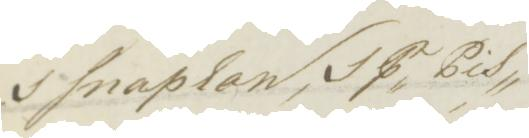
1 snaphan, 1 p„r Pis„
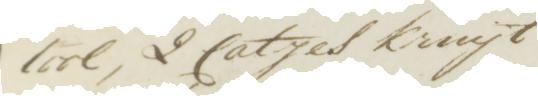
tool, 2 Catjes kruijt
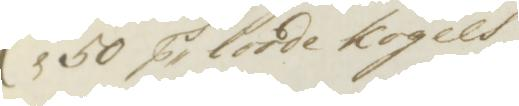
en 50 p„s loode kogels
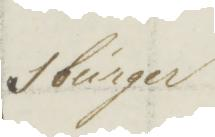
1 burger
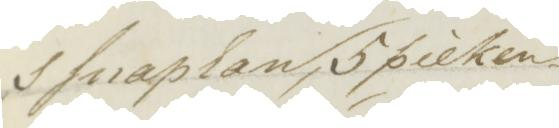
1 snaphan, 5 pieken
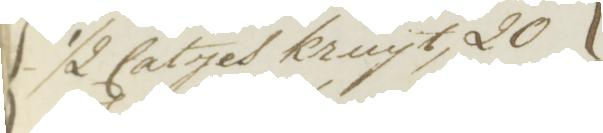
½ Catjes kruijt, 20
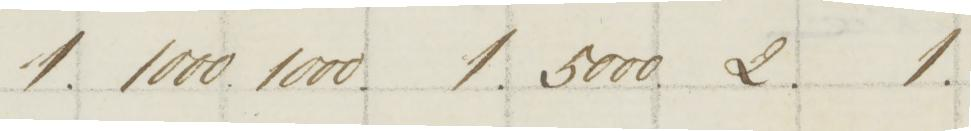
1. 1000. 1000. 1. 5000. 2. 1.
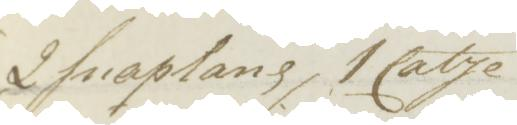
2 snaphanen, 1 Catje
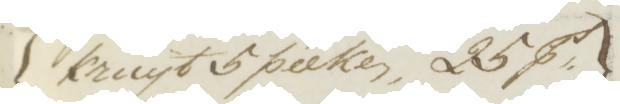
kruijt 5 pieken, 25 p„s
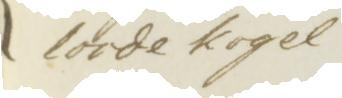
loode kogel
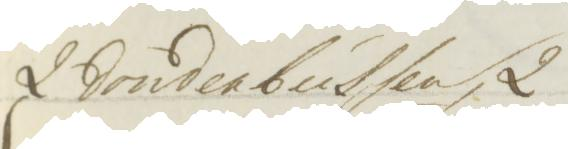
2 donderbussen, 2
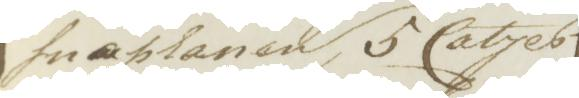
snaphanen, 5 Catjes
